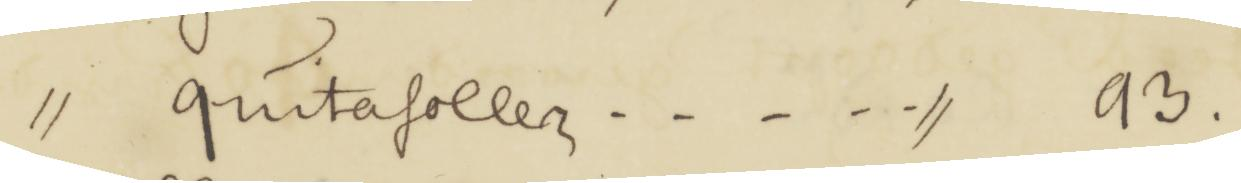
„ quitasollen - - - - - „ 43.
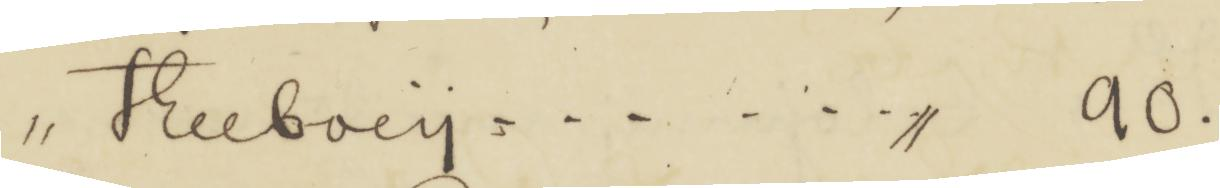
„ theeboeij - - - - - - „ 40.
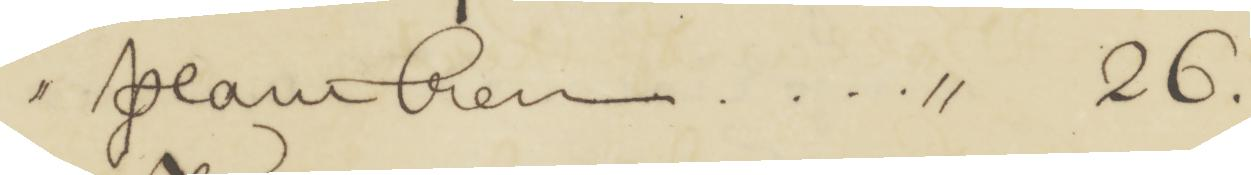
„ plancken - - - - „ 26.
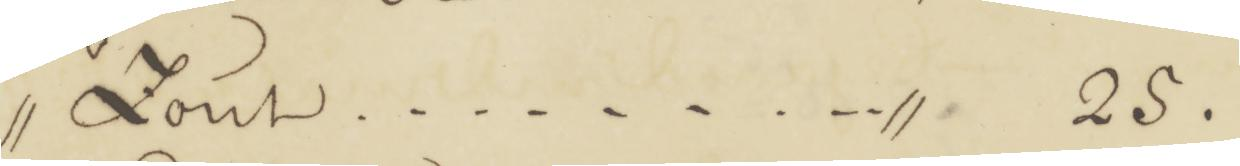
„ zout - - - - - - - - - -„ 25.
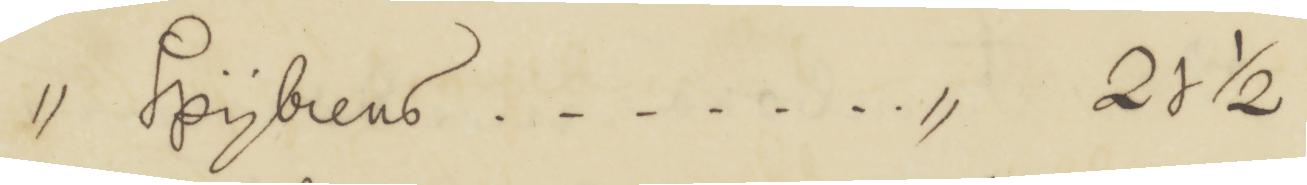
„ spijkers - - - - - - - „ 21½
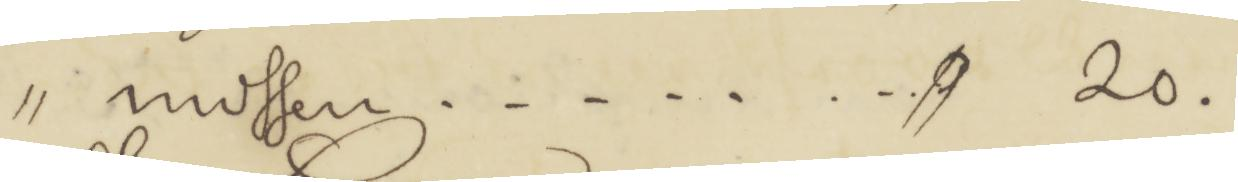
„ messen - - - - - - - - „ 20.
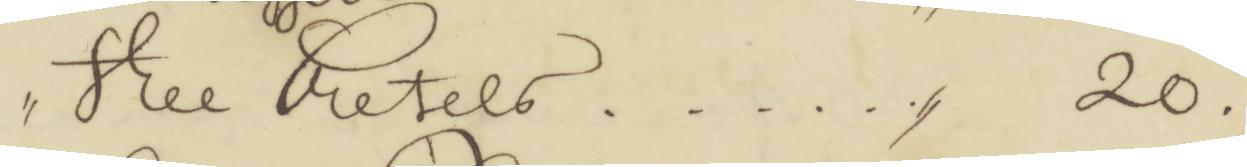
„ thee ketels - - - - - - „ 20.
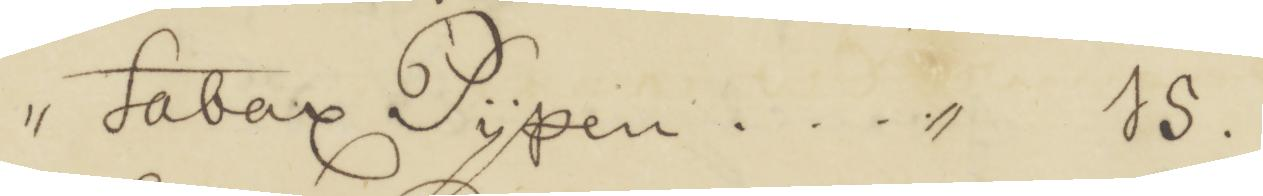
„ tabax Pijpen - - - -„ 15.
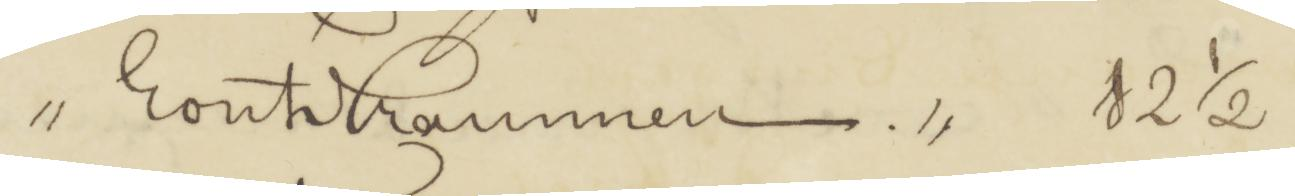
„ houte kammen -„ 12½
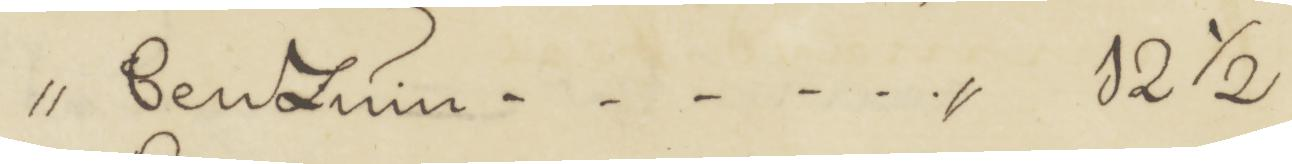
„ benzuin - - - - - - „ 12½
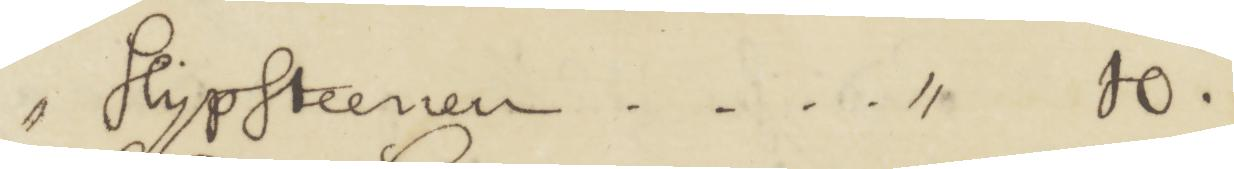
„ slijpsteenen - - - - „ 10.
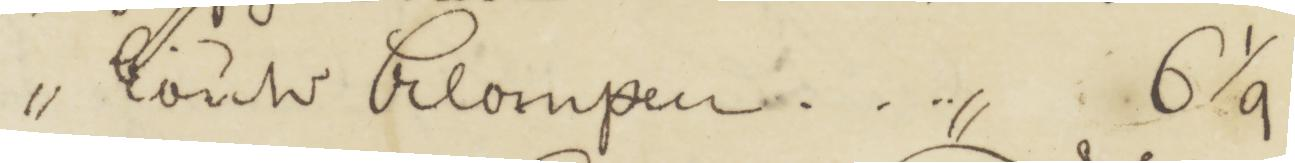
„ houte klompen - - - - „ 6¼
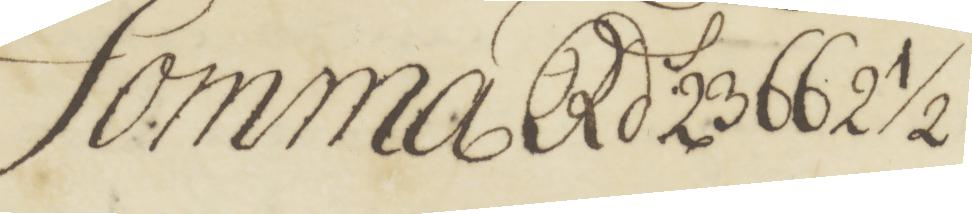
Somma Rd.s 23662½
